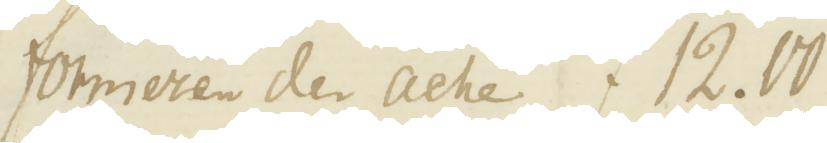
fomeren der acte ƒ 12.00
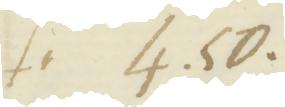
4 .50.
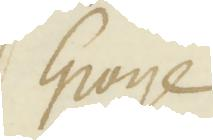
Groye
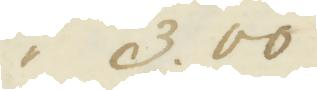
„ 3. 00
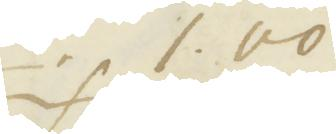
„ 1.00
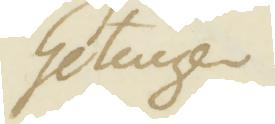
Getuigen
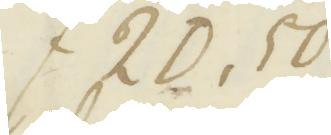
ƒ 22. 50
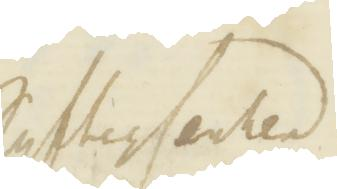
Vijftig Centen
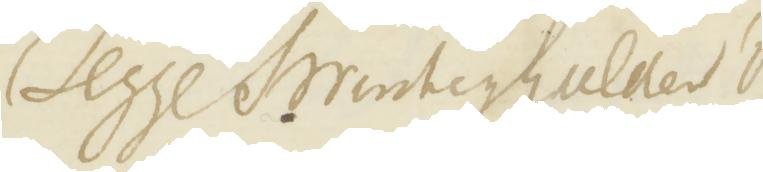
Zegge twintig Gulden
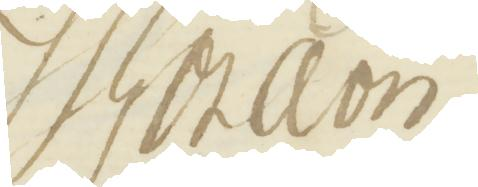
JfGordon
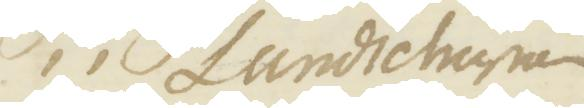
„Landschryver
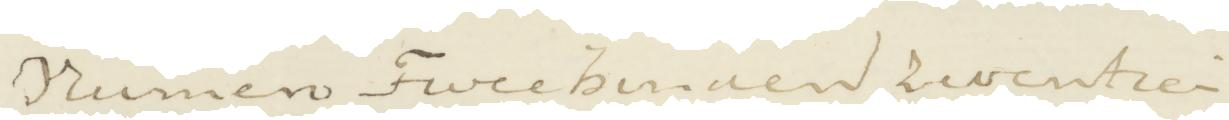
Numero Tweehonderd Zeventien
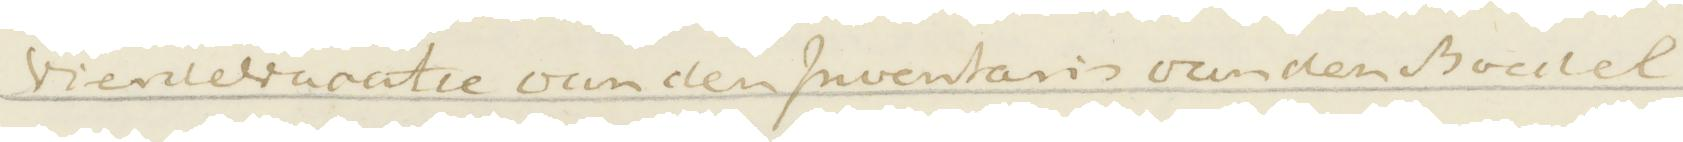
vierde vacatie van den Jnventais van den Boedel
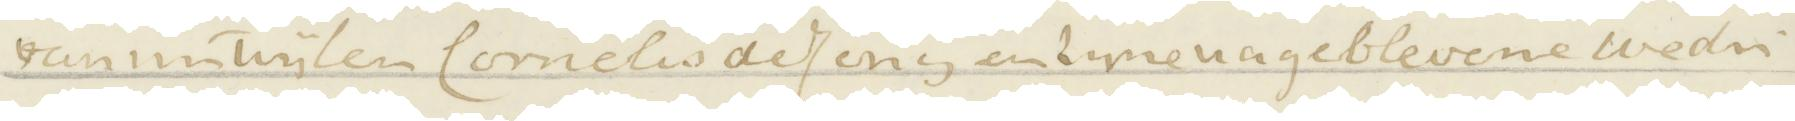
van nu wijlen Cornelis de Jong en Zyne nageblevene wedu
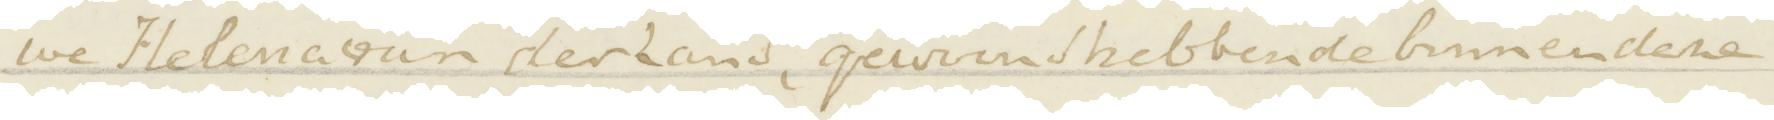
we Helena van der Zand gewoond hebbende binnen deze
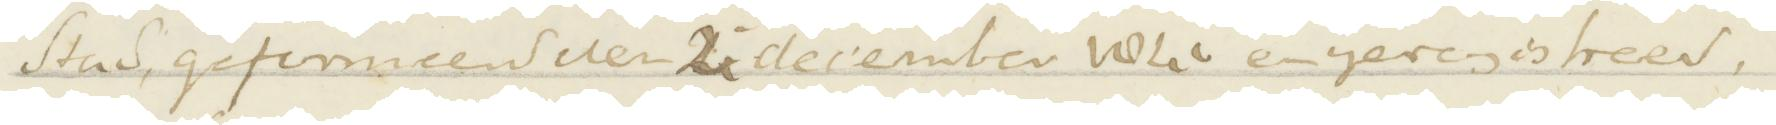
Stad, geformeerd den 4 ' december 1840 en geregistreerd,
